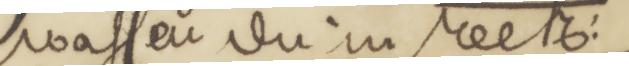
wassen en in reek:
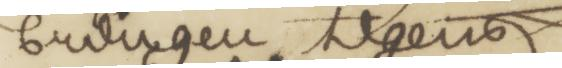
brengen tegens
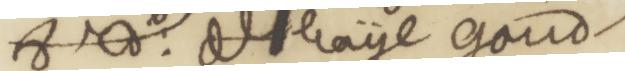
8 rd:s dethaijl goud
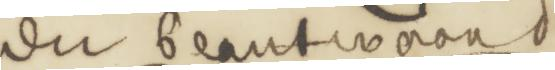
en beantwoord
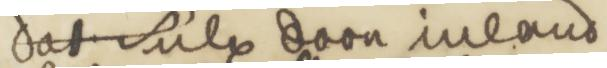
dat sulx door inland
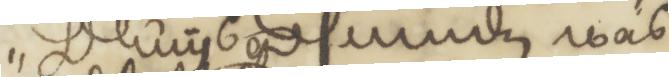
„sehuijsgesinnen was
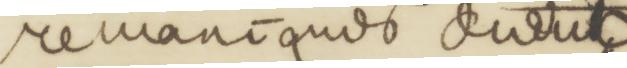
remarcques dienent
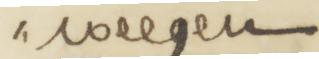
„weegen
